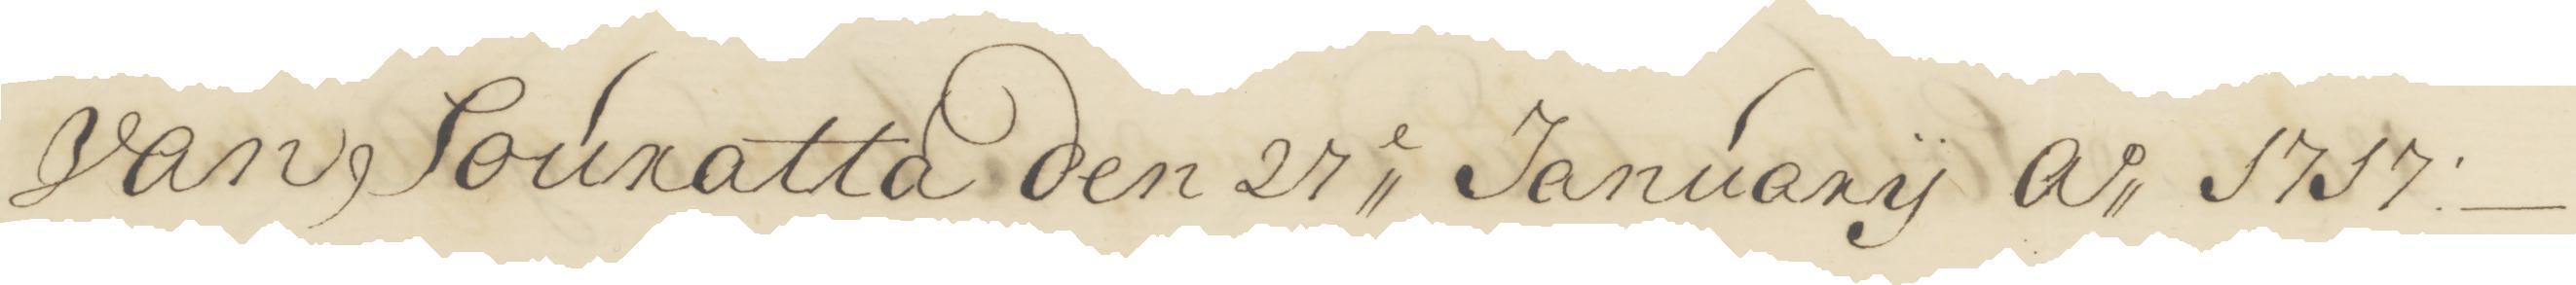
van Souratta den 27„e Ianuarij A„o 1717: —
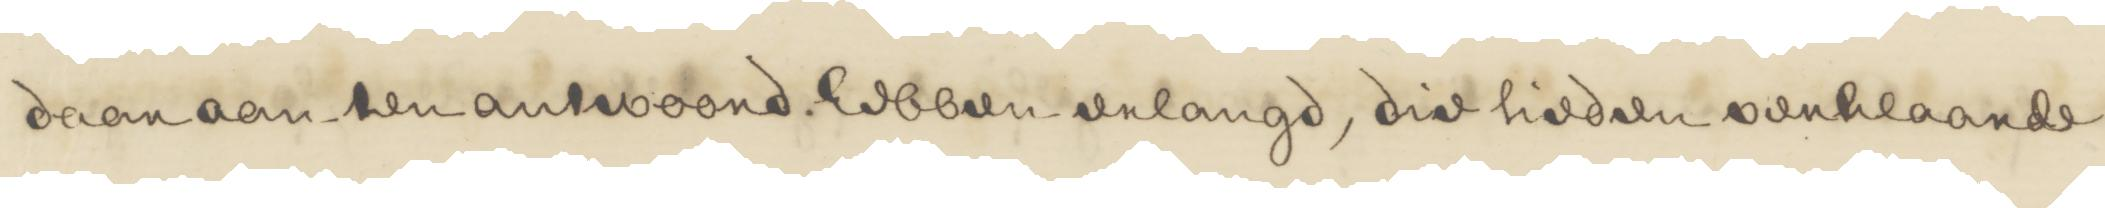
daar aan ten antwoord hebben erlangd, die lieden verklaarde
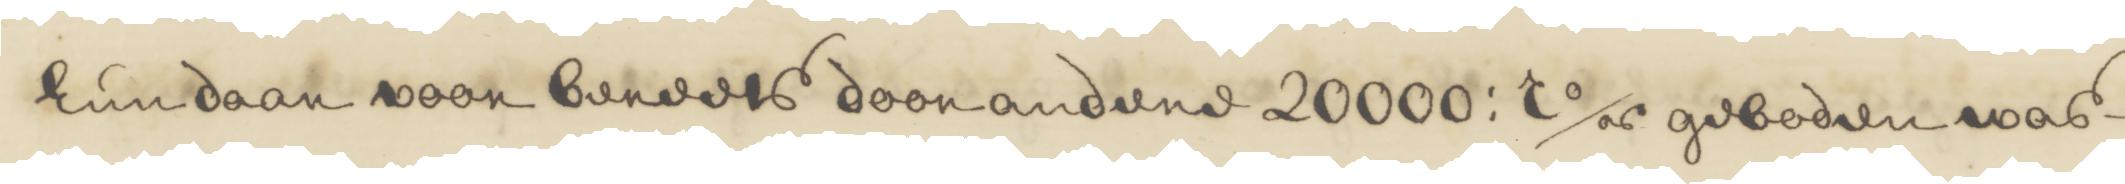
hun daar voor bereets door andere 20000: ro/as geboden was —
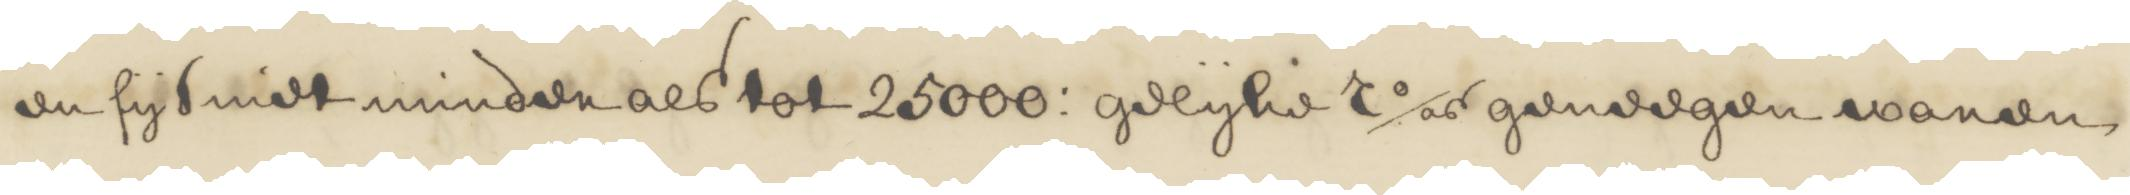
en sijt niet minder als tot 25000: gelijke ro/as geneegen waren,
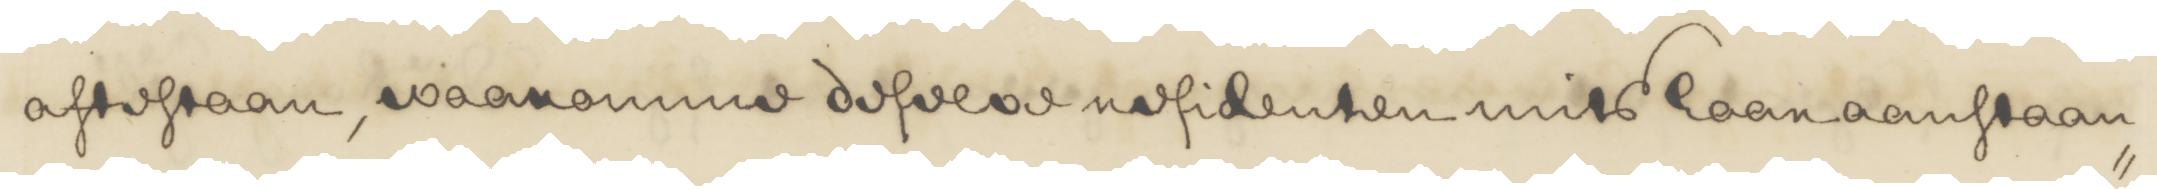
aftestaan, waaromme deselve residenten mits haar aanstaan„
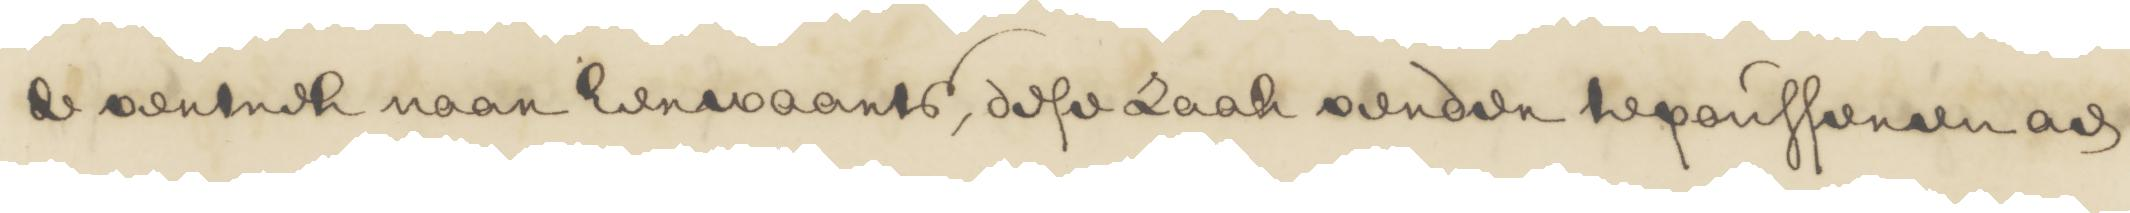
de vertrek naar herwaarts, dese zaak verder tepousseren aen
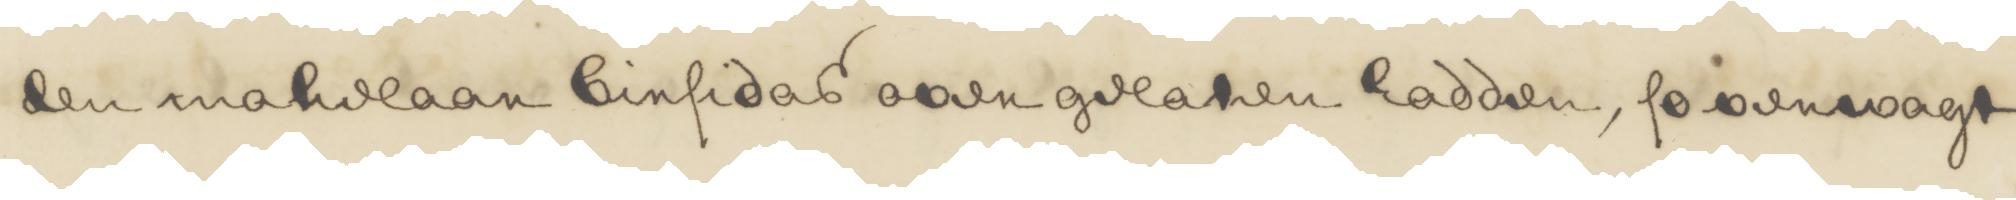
den makelaar birsidas over gelaten hadden, so verwagt
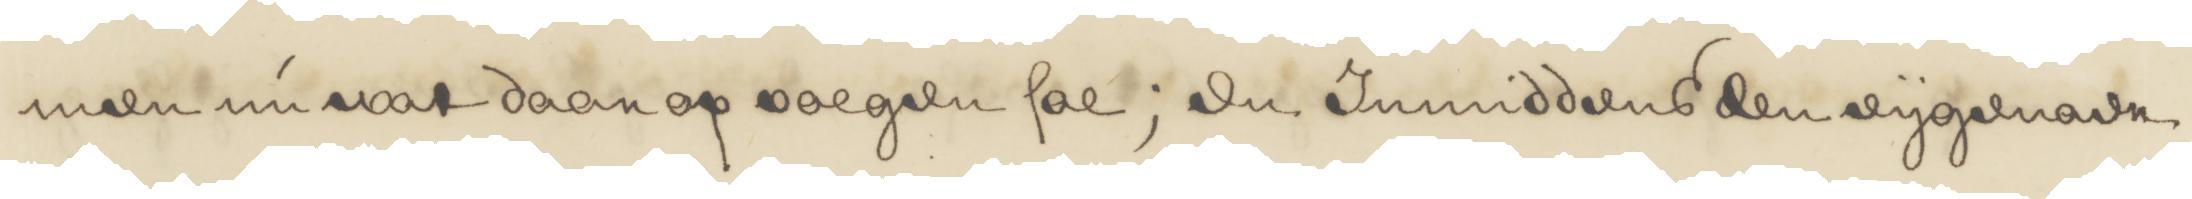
men nu wat daar op volgen sal; en Inmiddens den eijgenaer
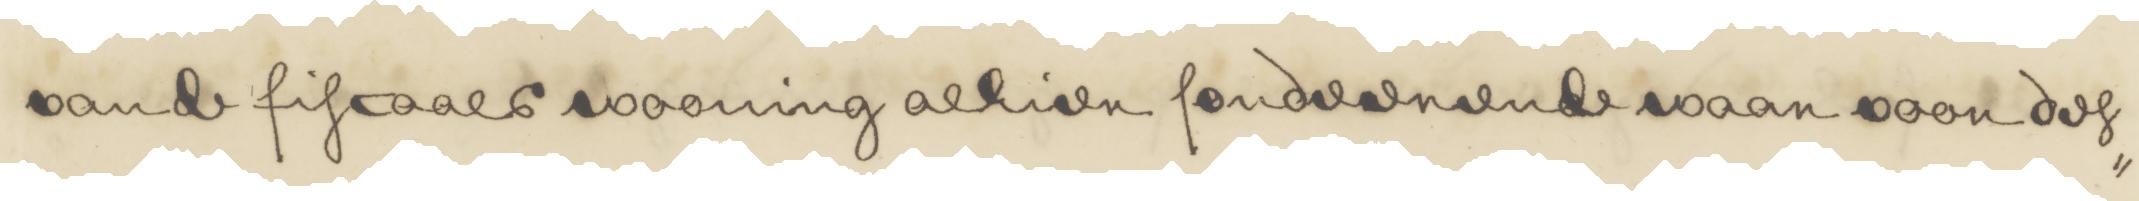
van de fiscaals wooning alhier sondeerende waar voor des„
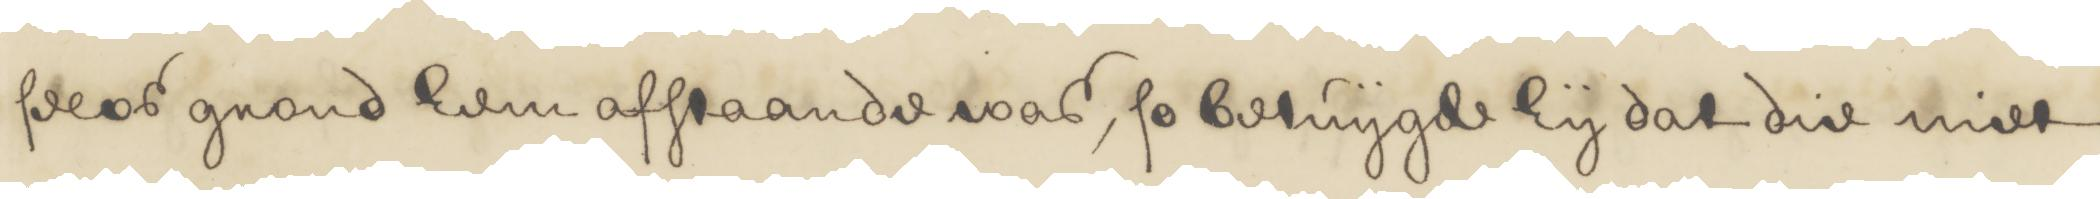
selvs grond hem afstaande was, so betuijgde hij dat die niet
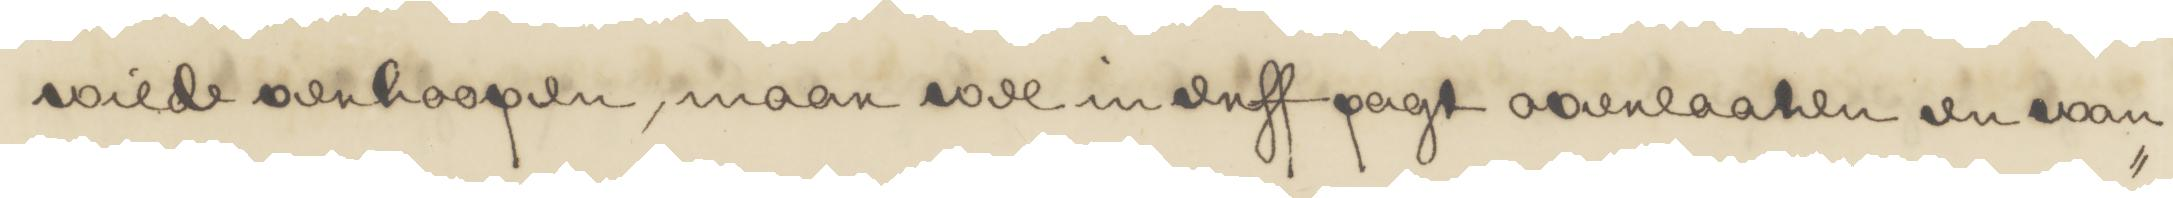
wilde verkoopen, maar wel in erff pagt overlaaten en wan„
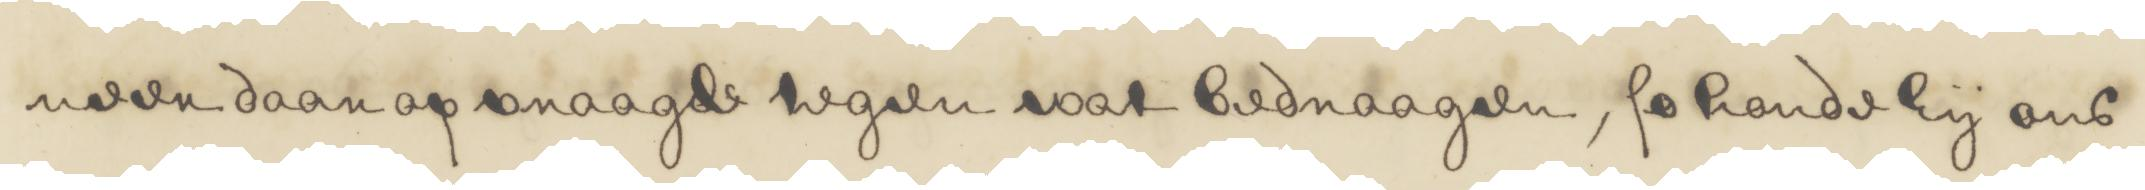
neer daar op vraagde tegen wat bedraagen, so konde hij ons
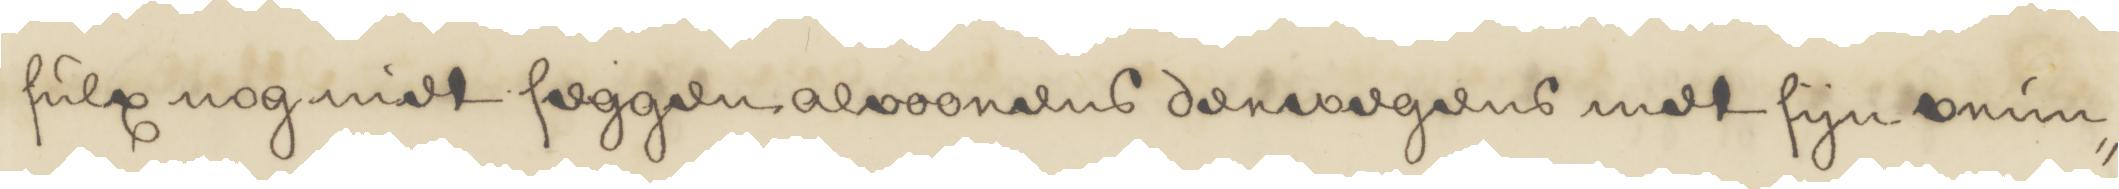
sulx nog niet seggen alvoorens derwegens met sijn vrun„
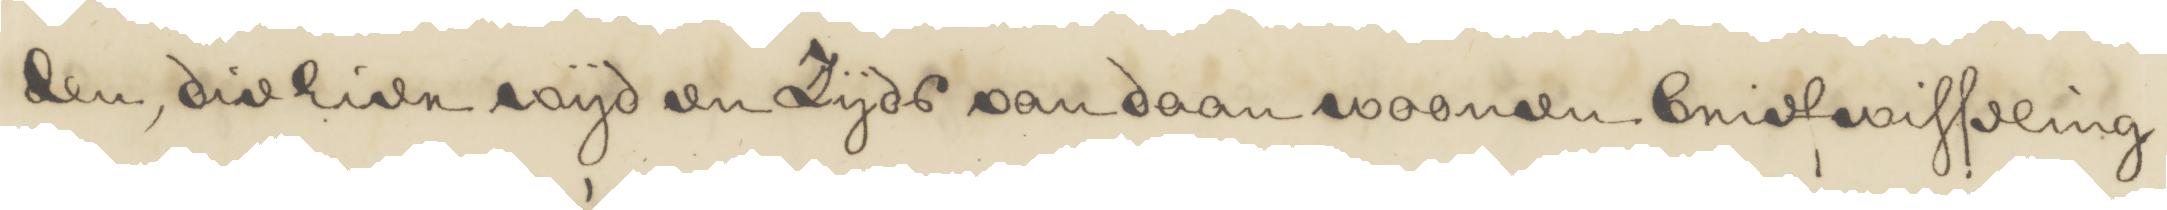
den, die hier wijd en zijds van daan woonen briefwisseling
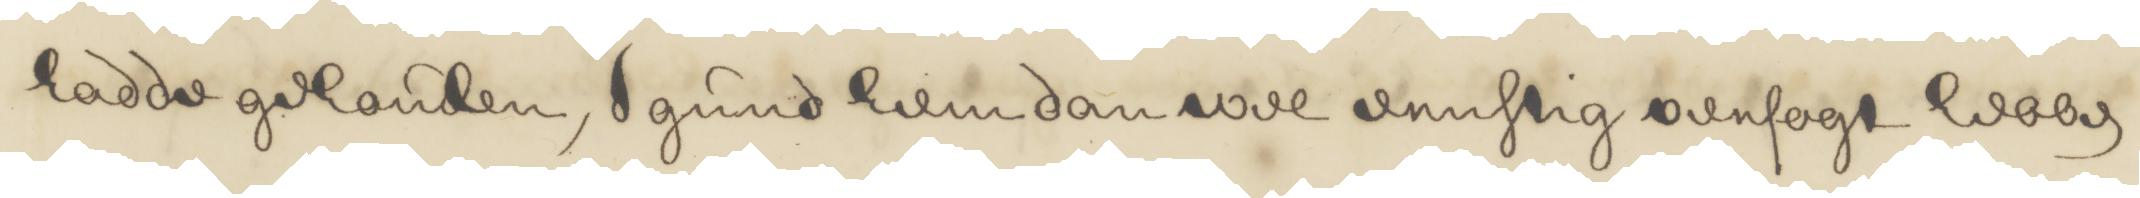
hadde gehouden, 't gund hem dan wel ernstig versogt hebben
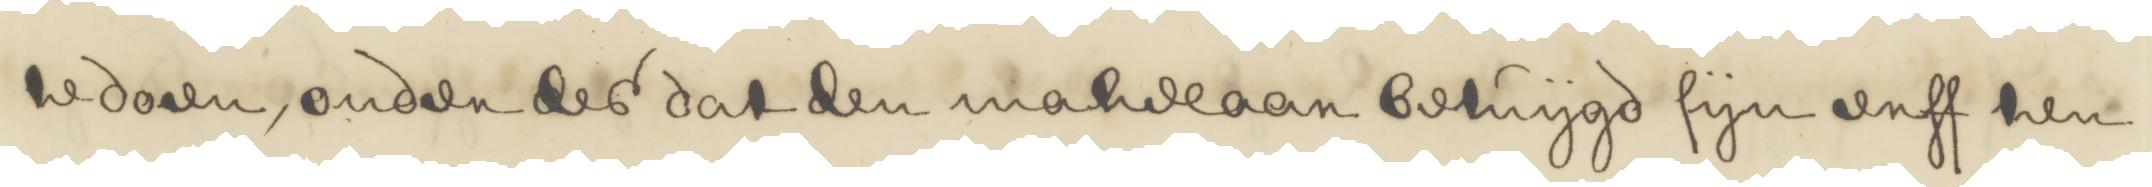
te doen, onder des dat den makelaar betuijgd sijn erff ten
